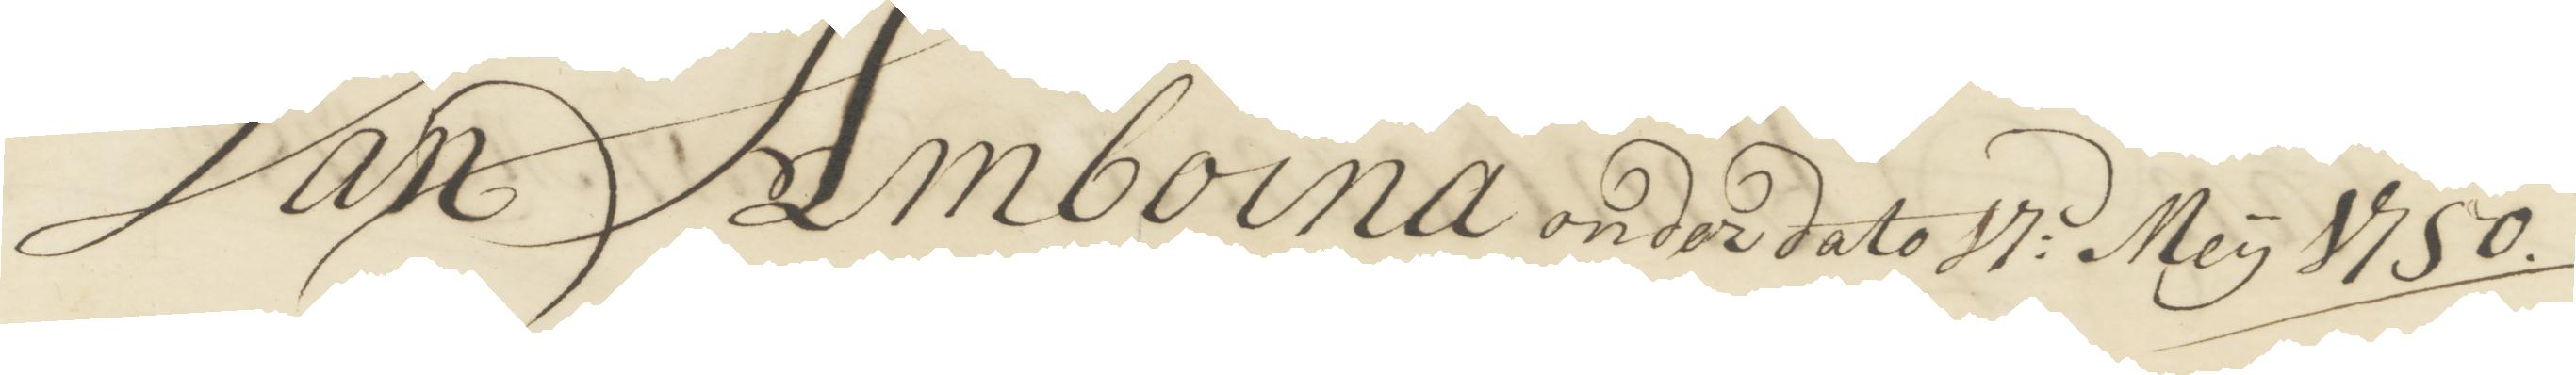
Van Amboina onder dato 17:' Meij 1750.
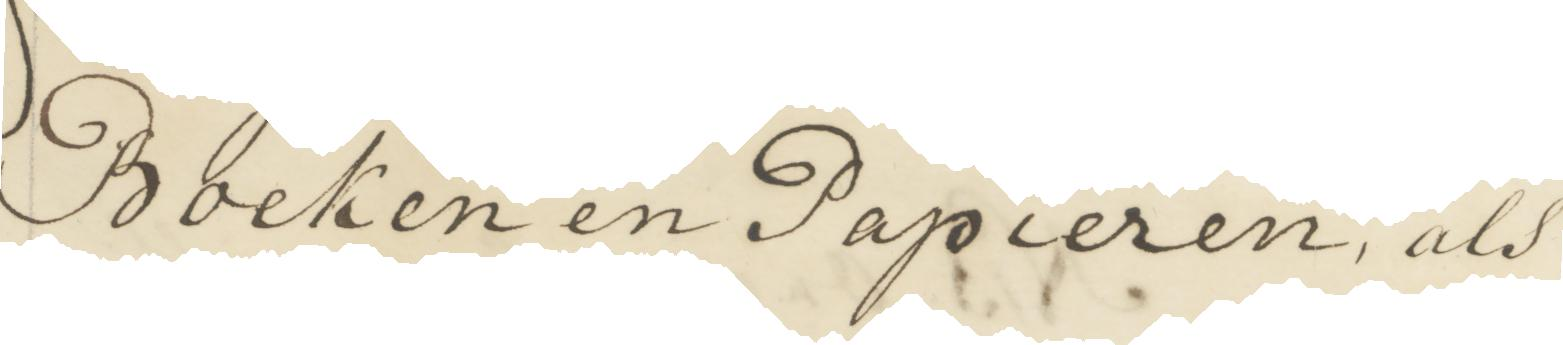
Boeken en Papieren, als
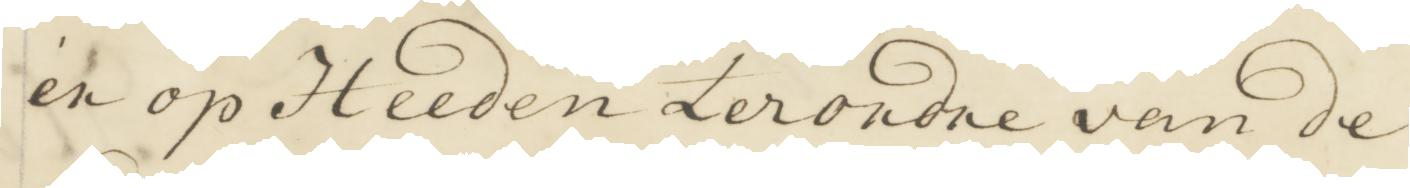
en op Heeden ter ordre van de
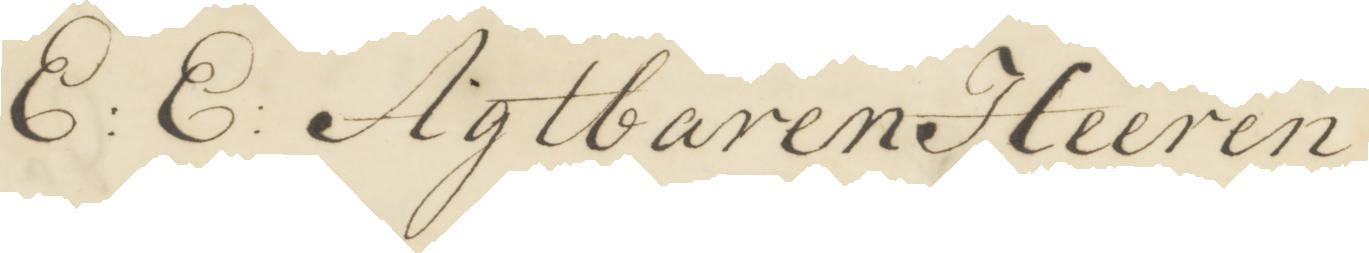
E: E: Agtbaren Heeren
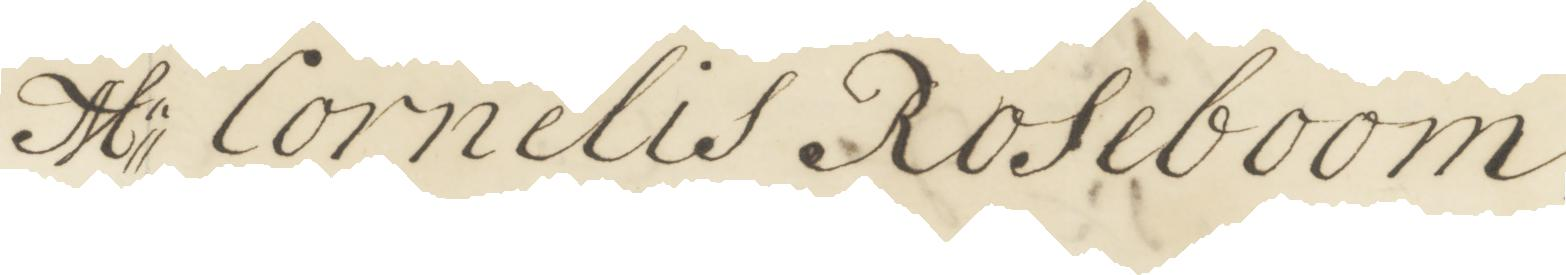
M„r Cornelis Roseboom,
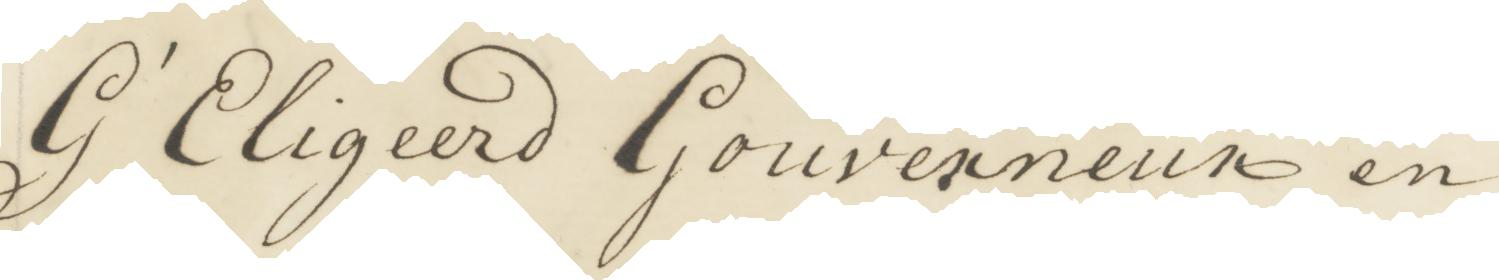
G’ Eligeerd Gouverneur en
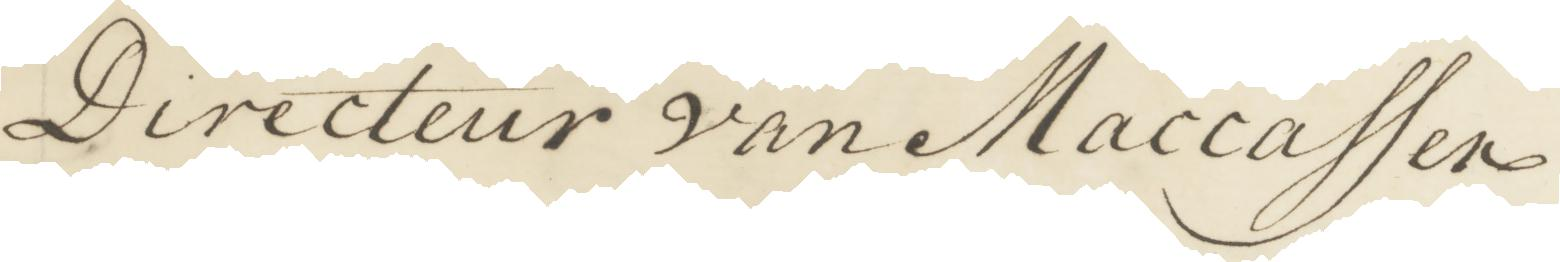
Directeur van Maccasser
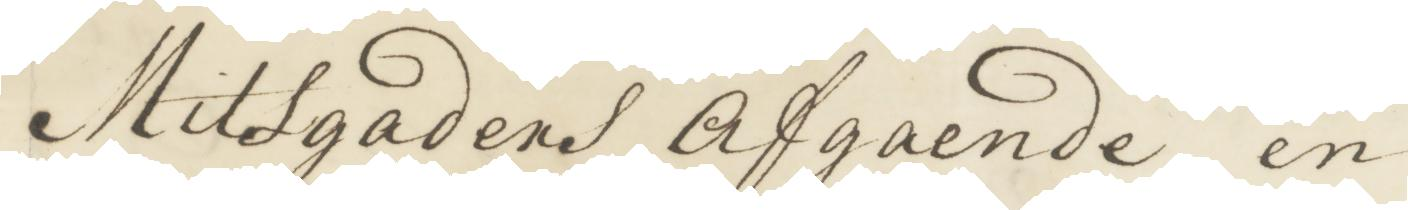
Mitsgaders afgaende en
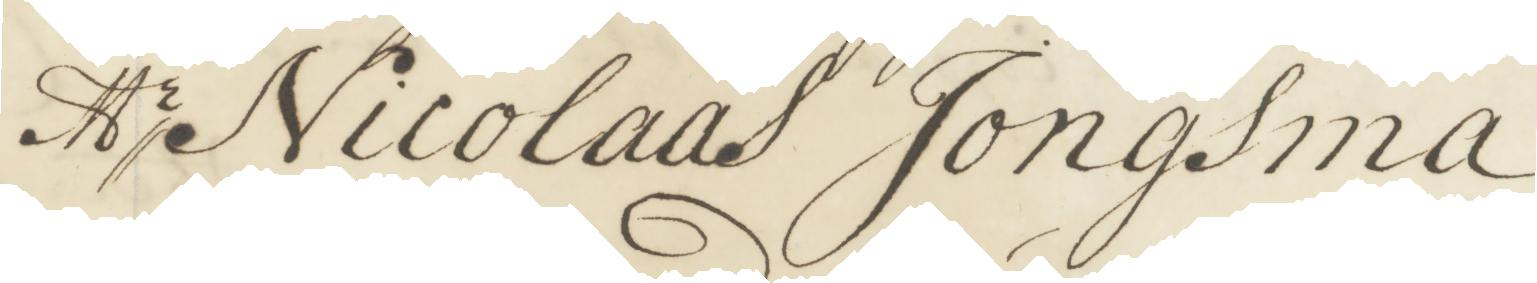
M„r Nicolaas Jongsma
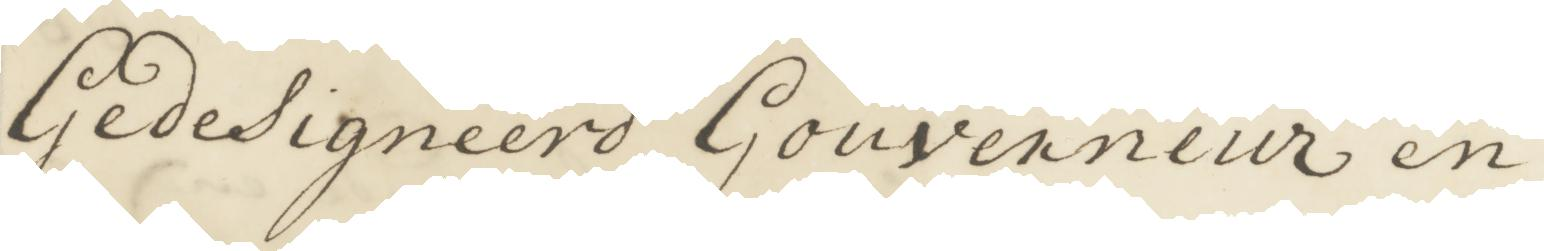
Gedesigneerd Gouverneur en
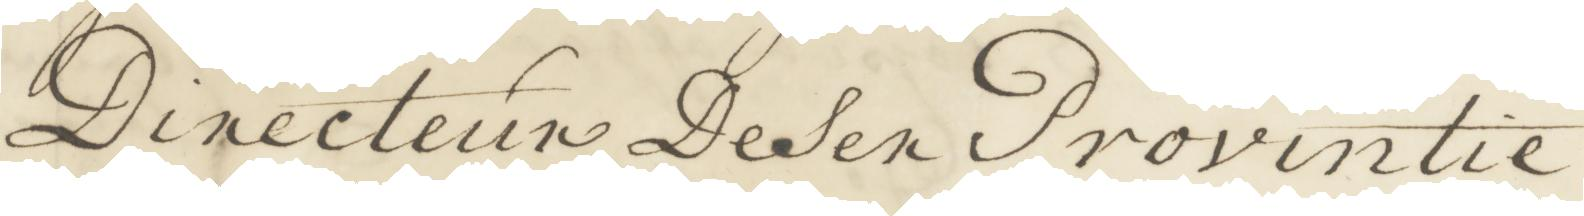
Directeur Deser Provintie
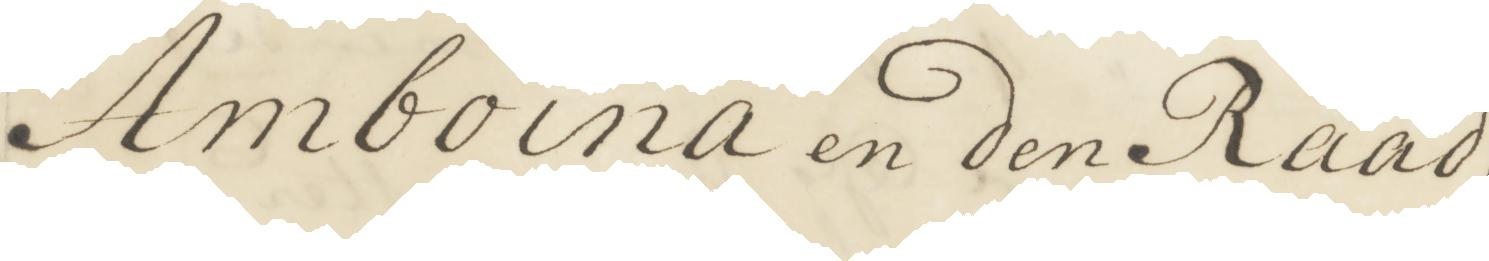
Amboina en den Raad,
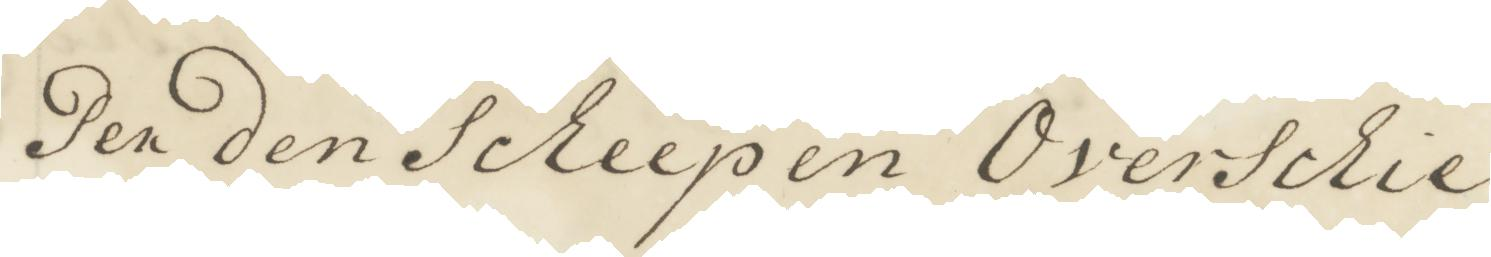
Per den scheepen Overschie
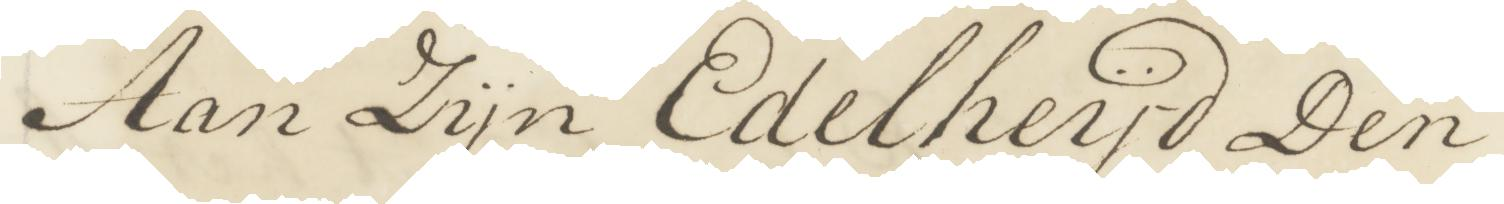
Aan Zijn Edelheijd Den
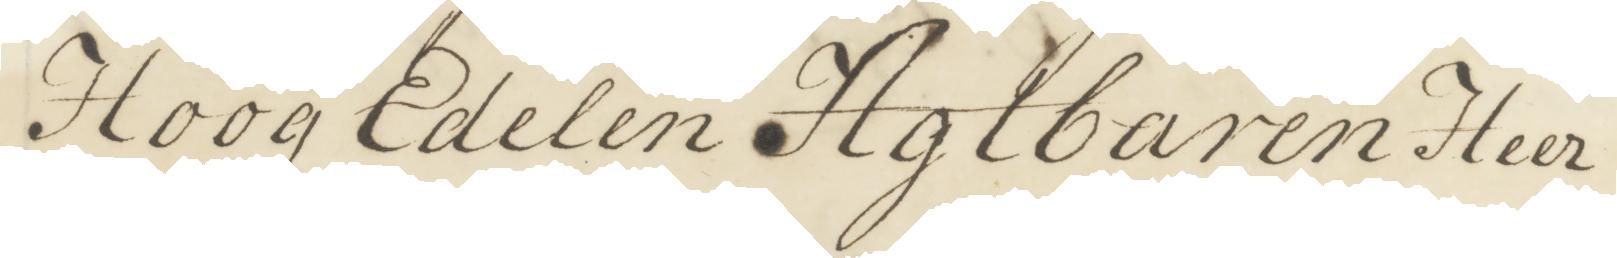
Hoog Edelen Agtbaren Heer
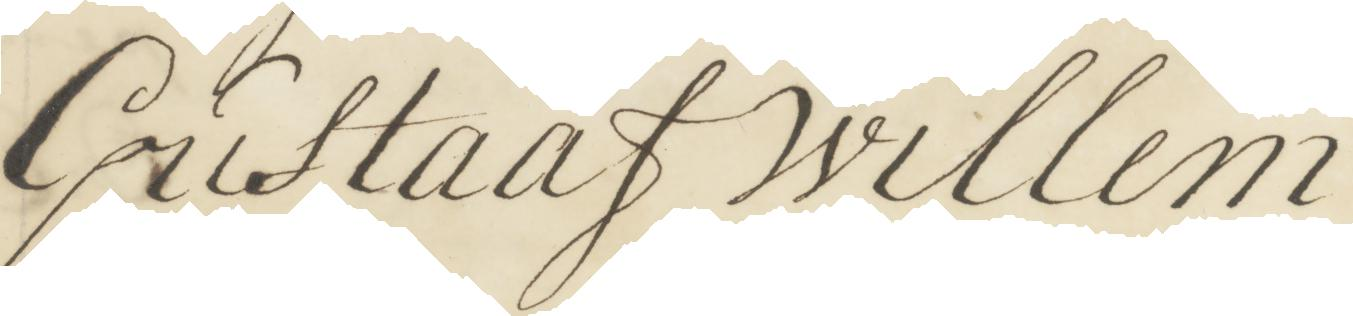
Gustaaf Willem
